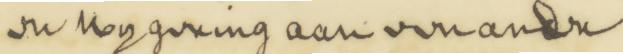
en Wygering aan een ander
